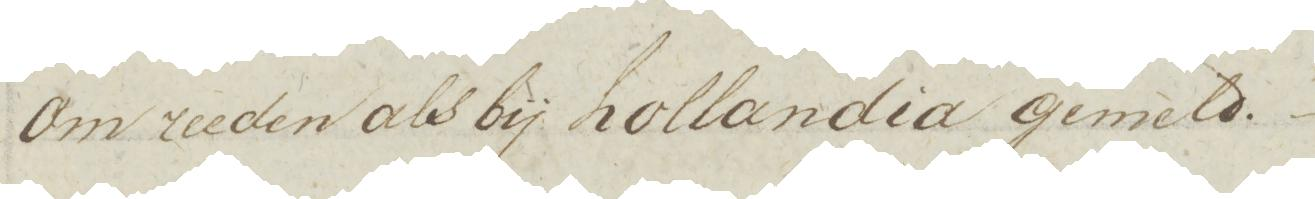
Om reeden als bij hollandia gemeld.
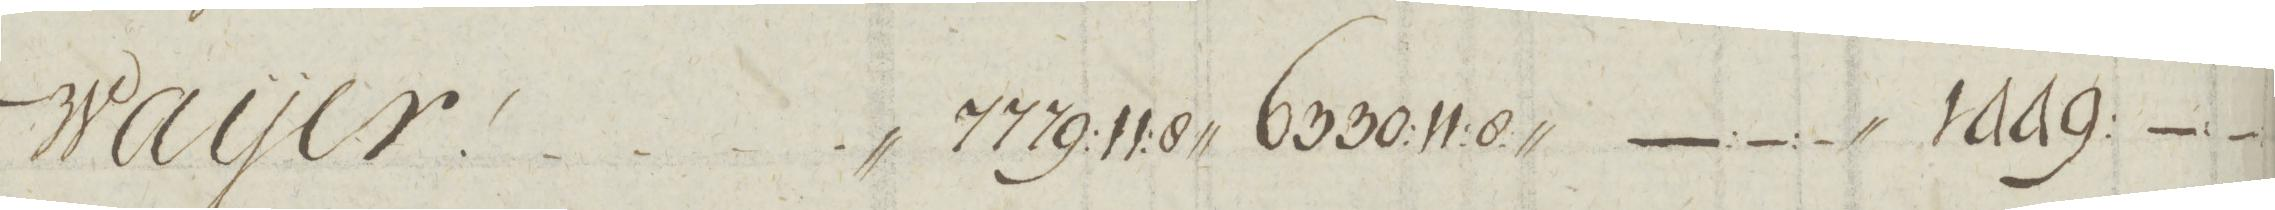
Waijer - - - - - „ 7779:11:8 „ 6330:11:8: „ —: —: - „ 1449: —: —
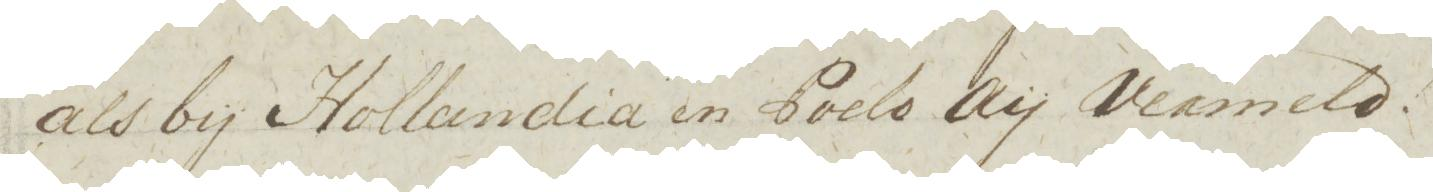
als bij Hollandia en Poelo Aij vermeld.
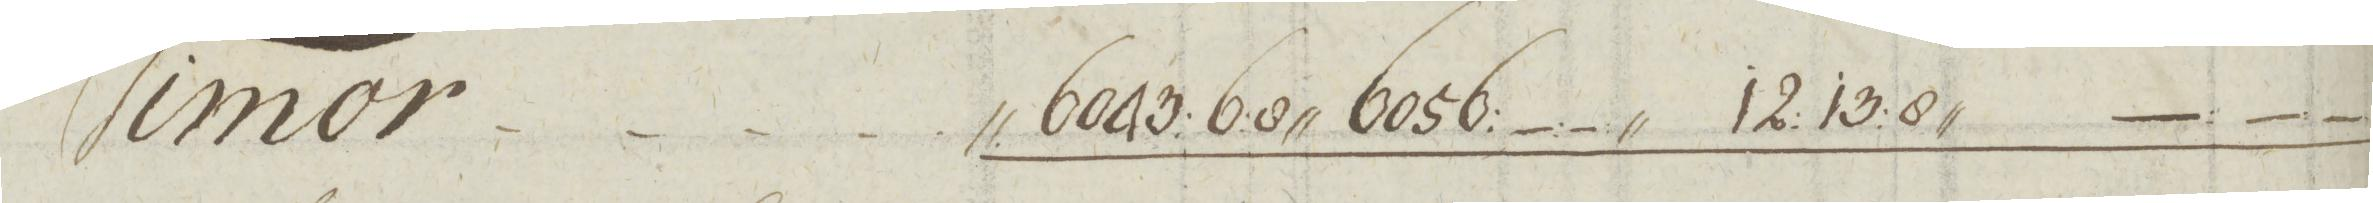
Timor - - - - - „ 6043: 6:8„ 6056: —: —: „ 12: 13: 8 „ —: —: —
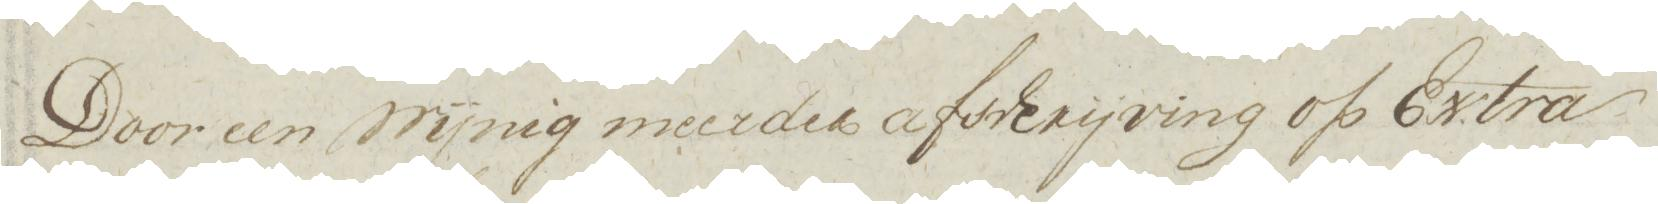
Door een wijnig meerder afschrijving op Extra
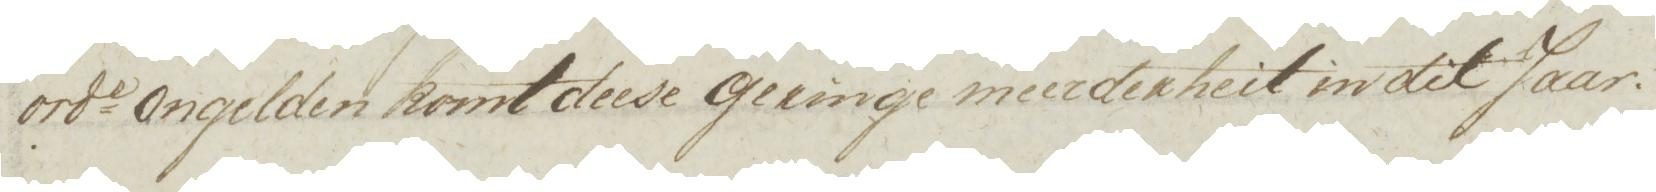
ord=e ongelden komt deese geringe meerderheit in dit Jaar.
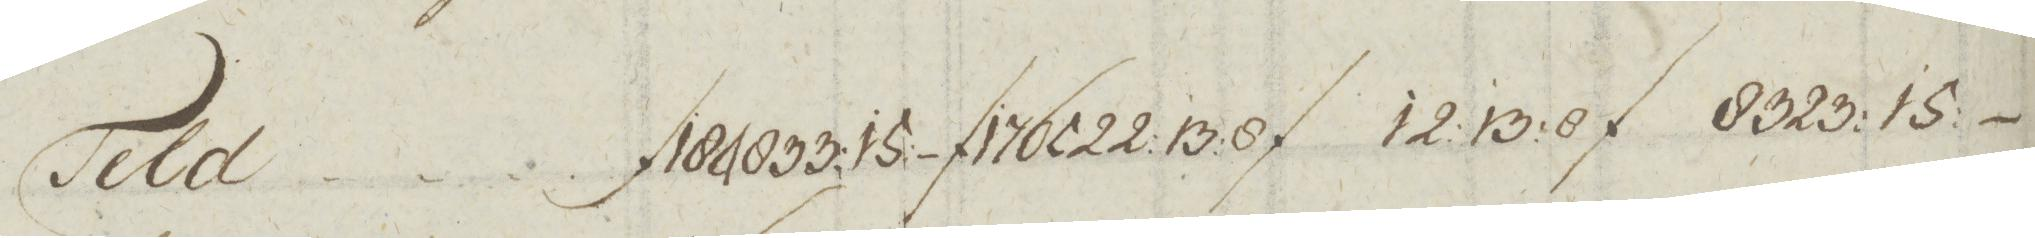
Teld - - - - ƒ184833:15:- ƒ176522:13:8 ƒ 12: 13: 8 ƒ 8323: 15: —
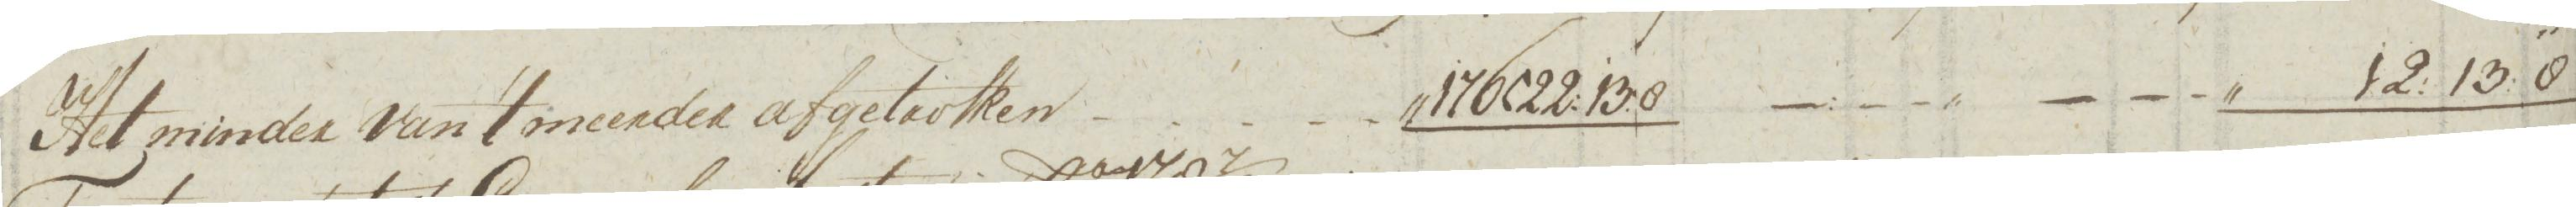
Het minder van ’t meerder afgetrokken - - - - - „176522: 13: 8 —: — - „ — — - „ 12: 13: 8:
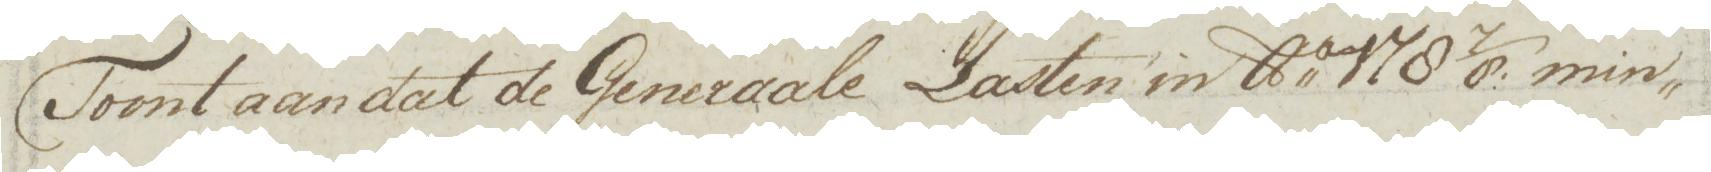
Toont aan dat de Generaale Lasten in A„o 1787/8: min„
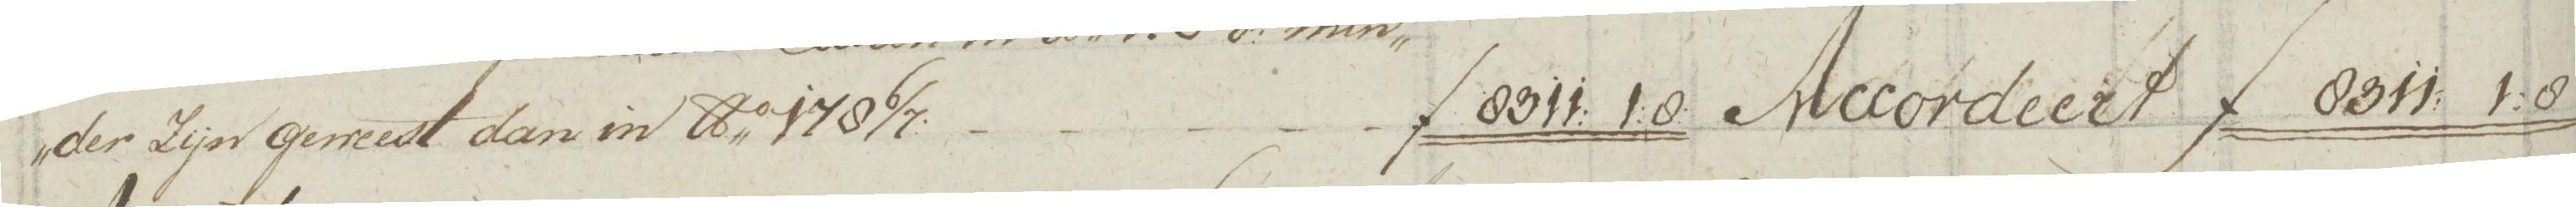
„der zijn geweest dan in A„o 1786/7: - - - - - ƒ 8311: 1: 8: Accordeert ƒ 8311: 1: 8
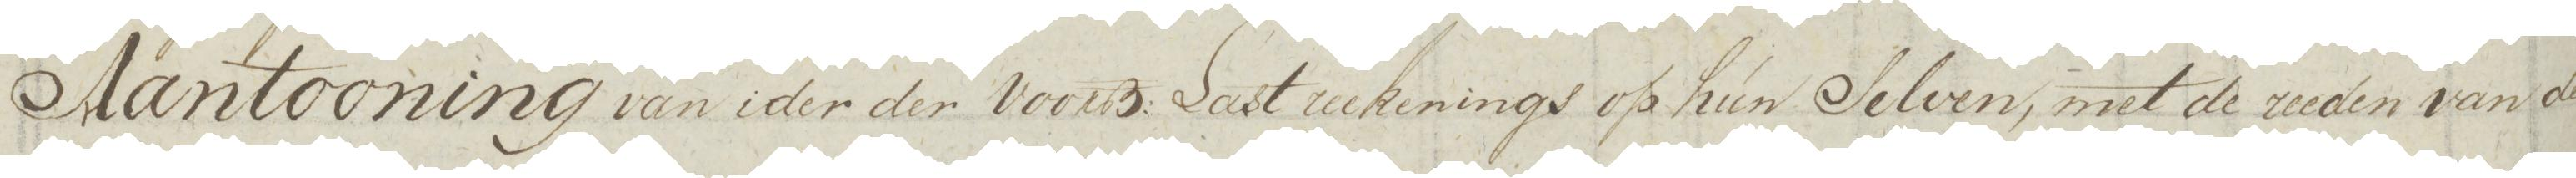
Aantooning van ider der voorsz: Last reekenings op hun Selven, met de reeden van der
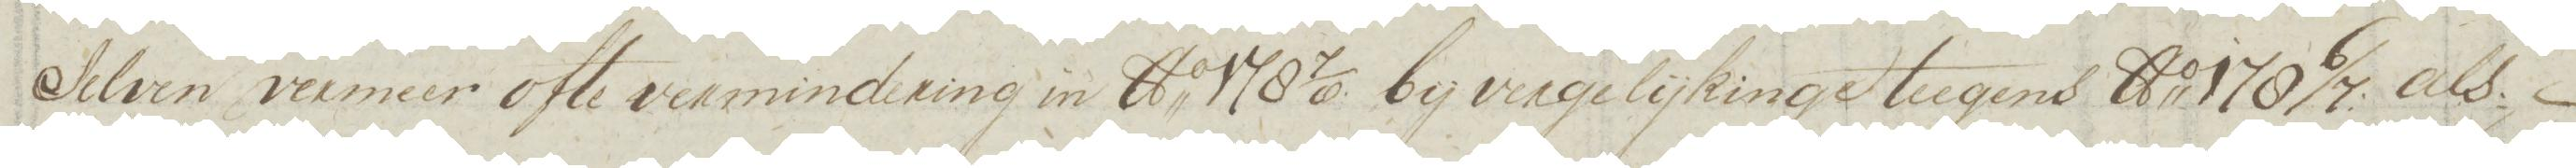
selven vermeer ofte vermindering in A„o1787/8: bij vergelijkinge teegens A„o 1786/7: als: —
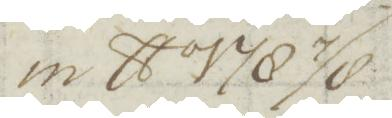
in A:o 1787/8:
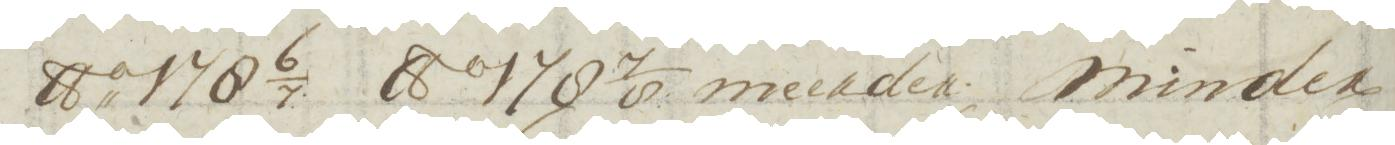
A„o1786/7: A:o1787/8: meerder. minder
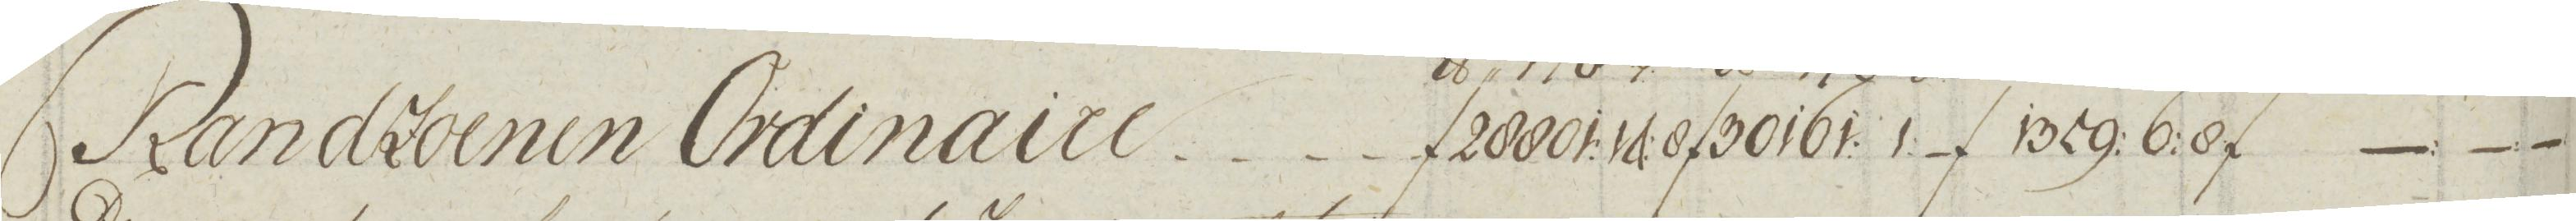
Randzoenen Ordinaire - - - -ƒ 28801:14:8 ƒ30161: 1: —ƒ 1359: 6: 8 ƒ —: —: -
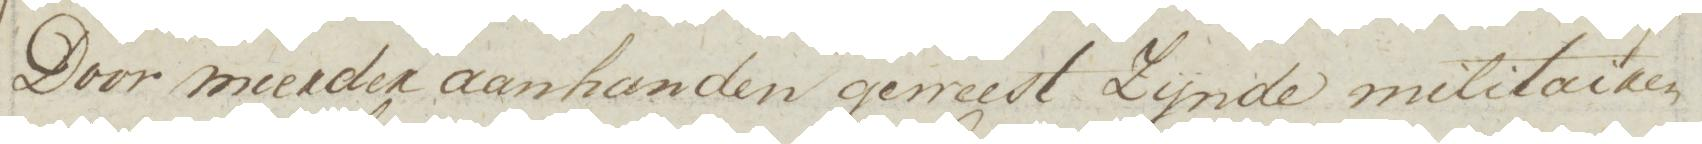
Door meerder aanhanden geweest zijnde militairen
